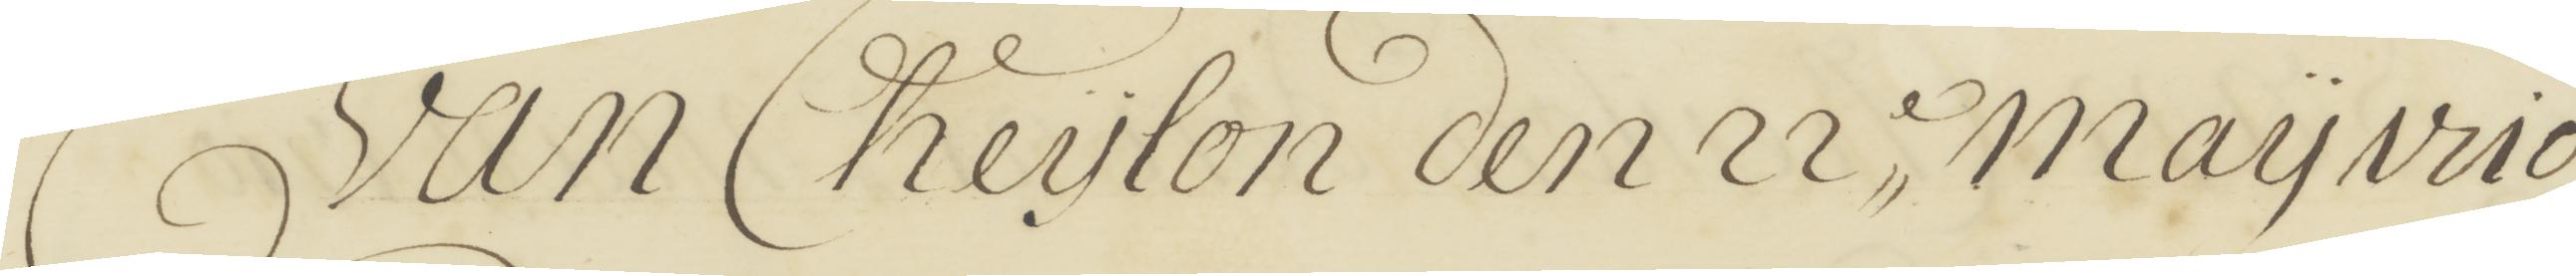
van Cheijlon den 22„e Maij 1710
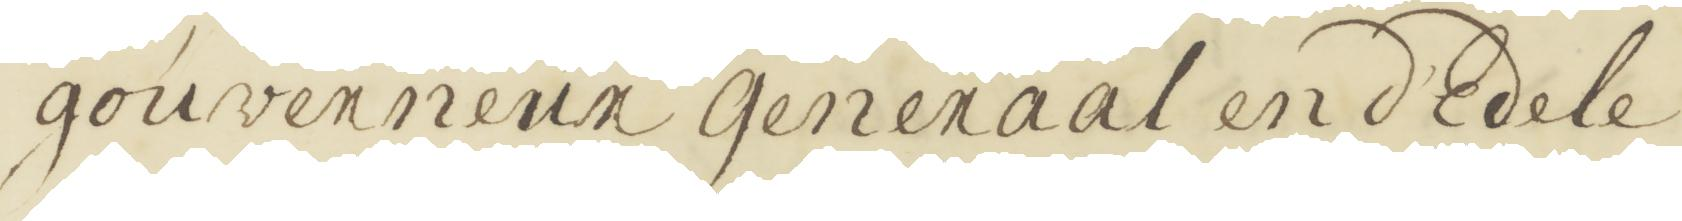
gouverneur generaal en d’ Edele
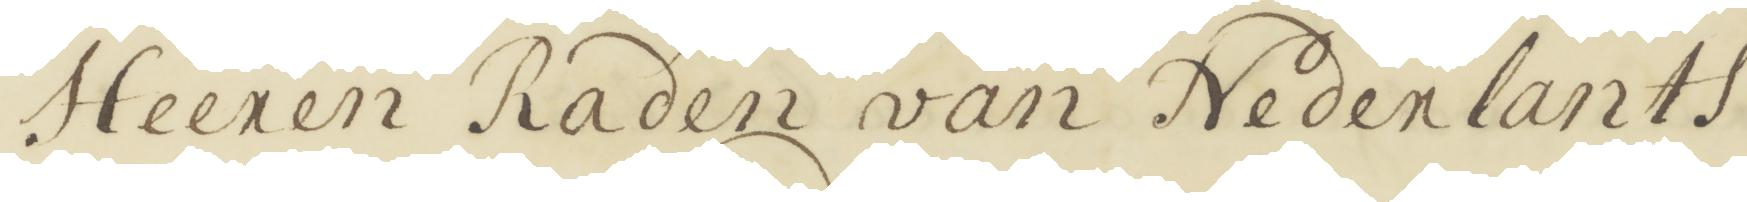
Heeren Raden van Nederlants
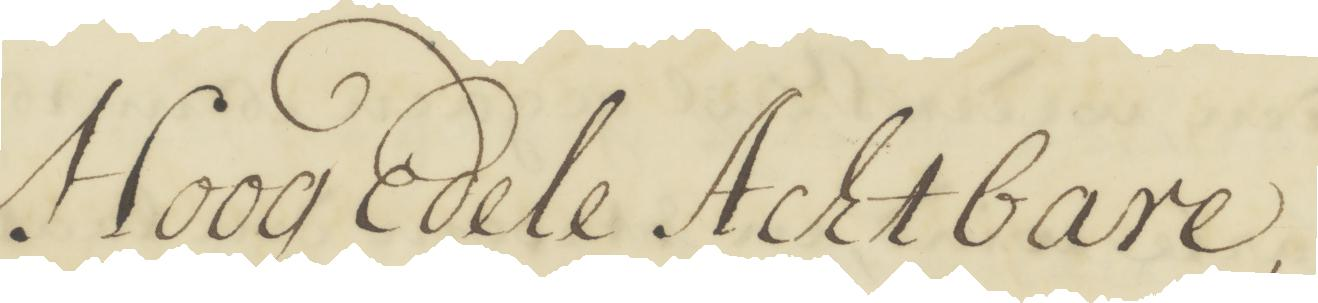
Hoog Edele Achtbare,
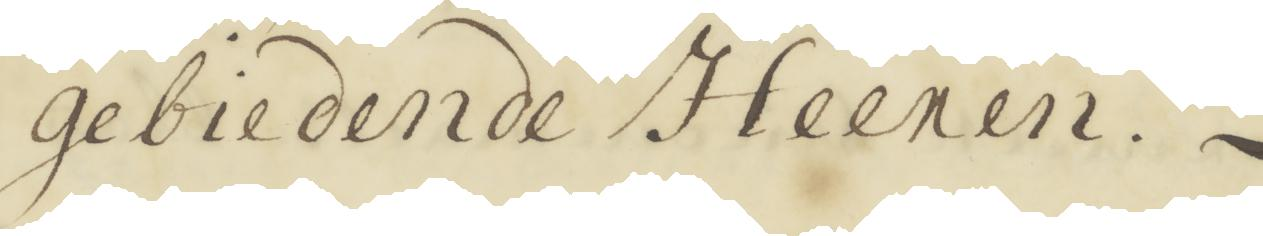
gebiedende Heeren. —
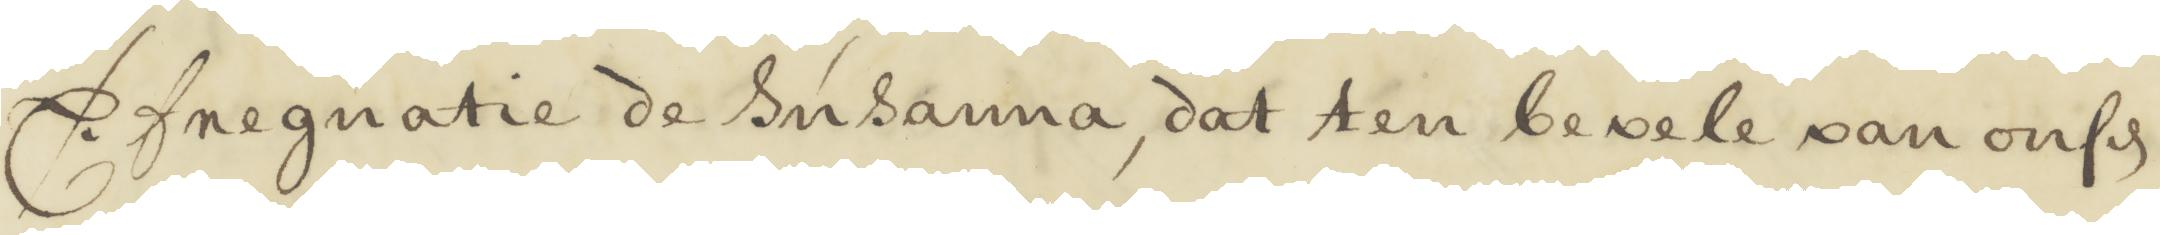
T freguatie de susanna, dat ten bevele van onsen
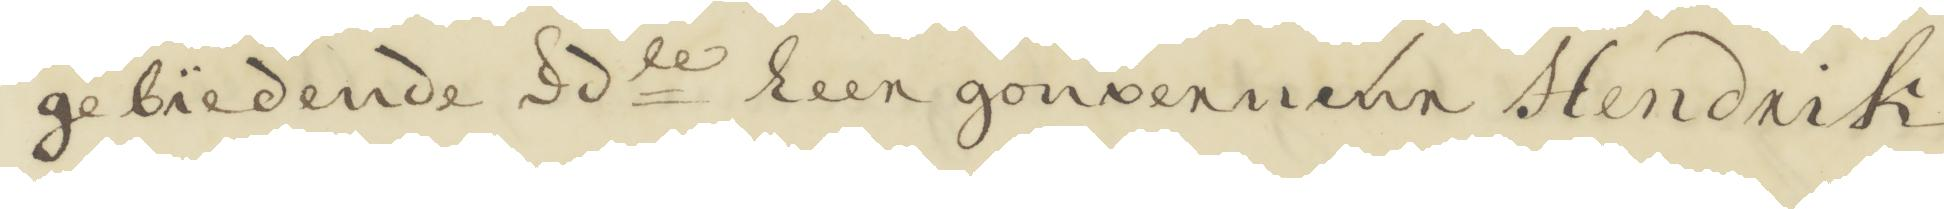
gebiedende Ed=le heer gouverneur Hendrik
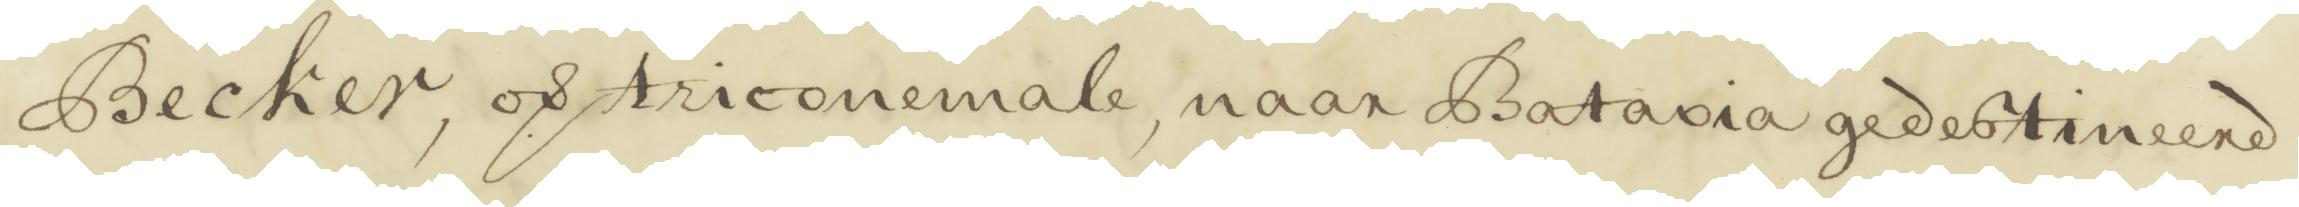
Becker, over triconemale, naar Batavia gedestineerd
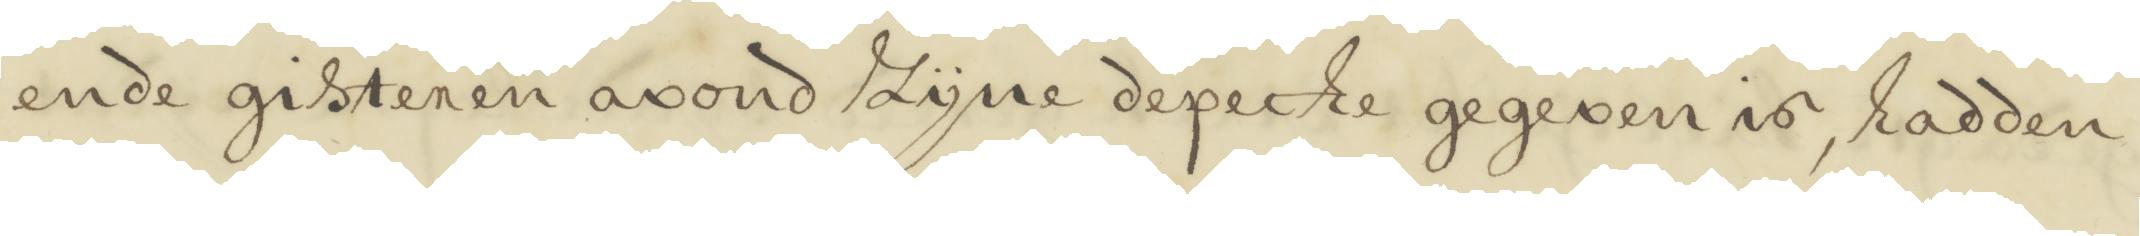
ende gisteren avond zijne depeche gegeven is, hadden
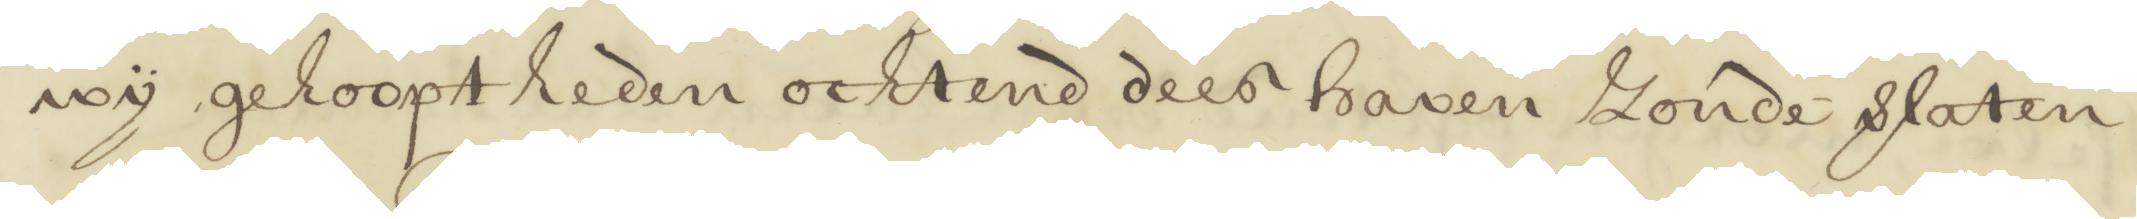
wij gehoopt heden ochtend dees haven zoude verlaten
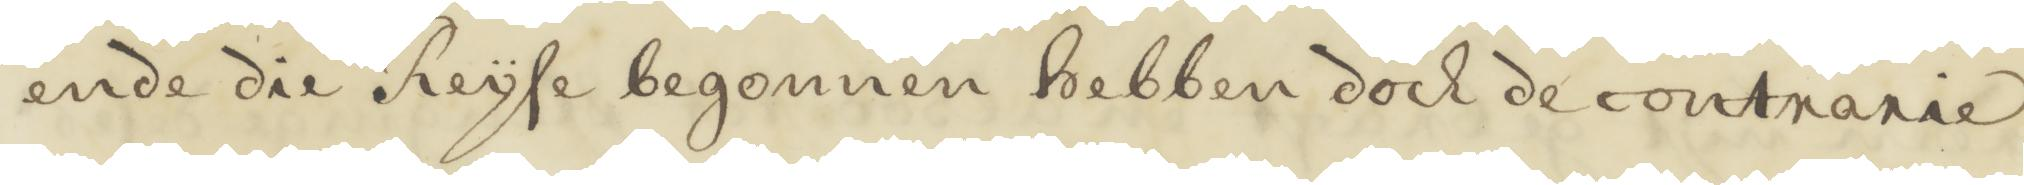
ende die Reijse begonnen hebben doch de contrarie
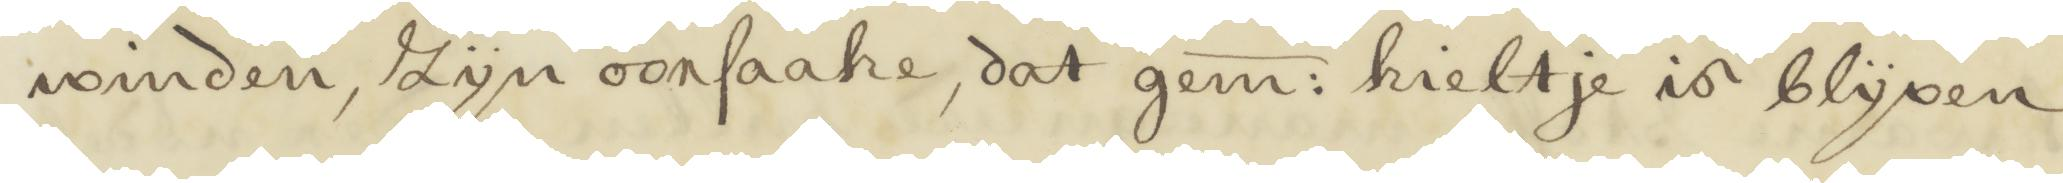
winden, zijn oorsaake, dat gem: kieltje is blijven
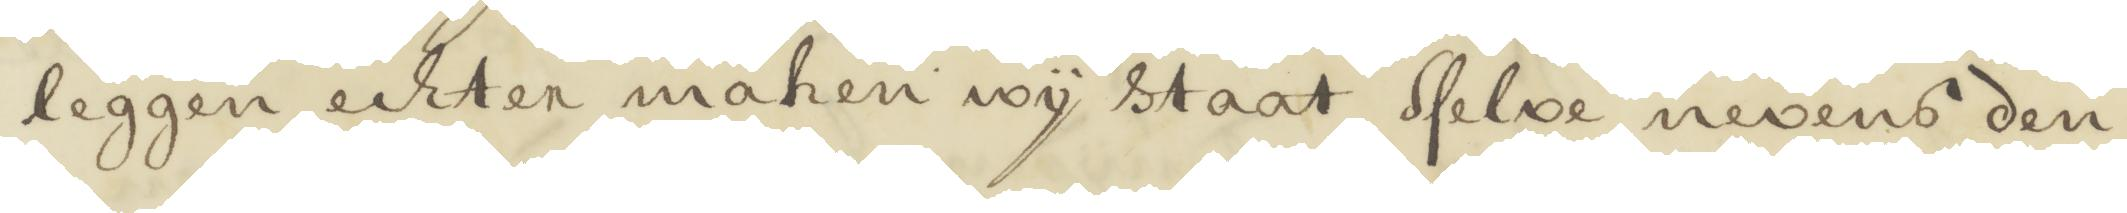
leggen, echter maken wij staat, tselve, nevens den
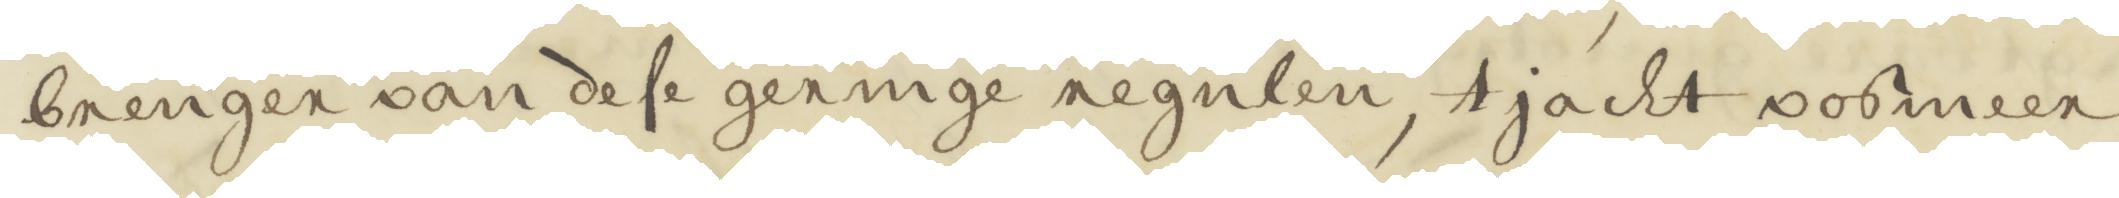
brenger van dese geringe regulen, t jacht vosmeer
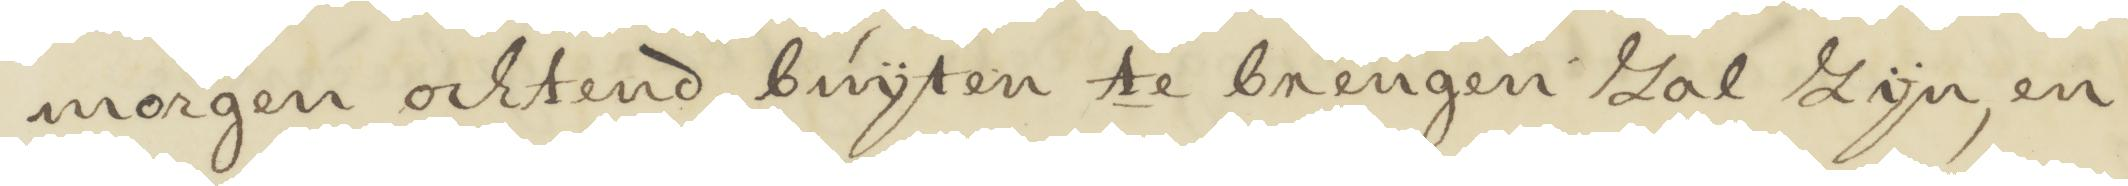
morgen ochtend, buijten te brengen zal zijn, en
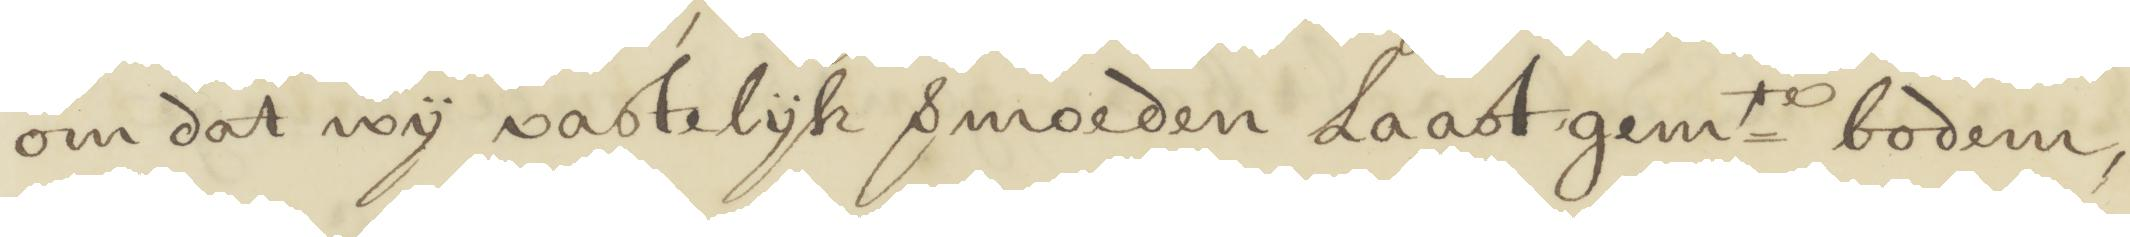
om dat wij vastelijk vermoeden Laast gem=te bodem,
